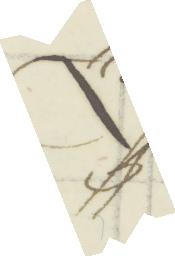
H
